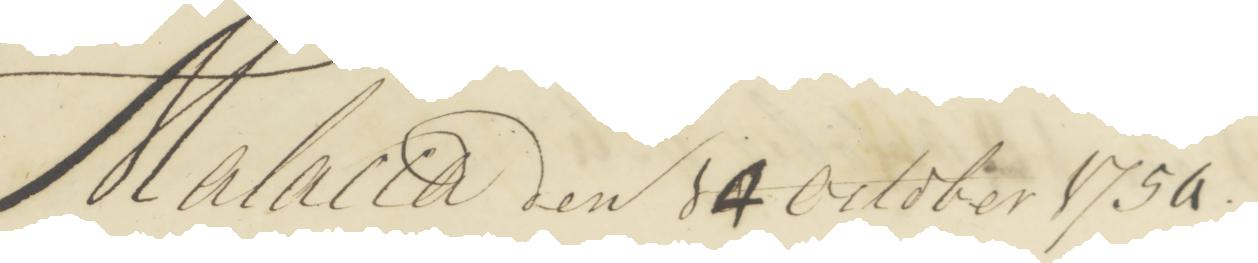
Malacca den 14 october 1754.
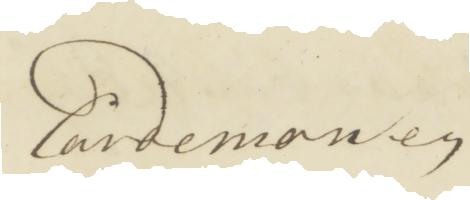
Cardemon en
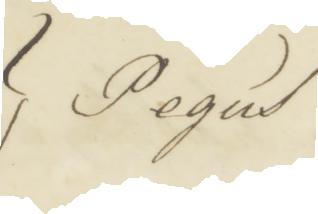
Pegus
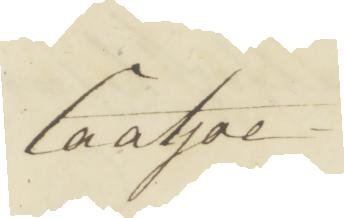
Caatjoe
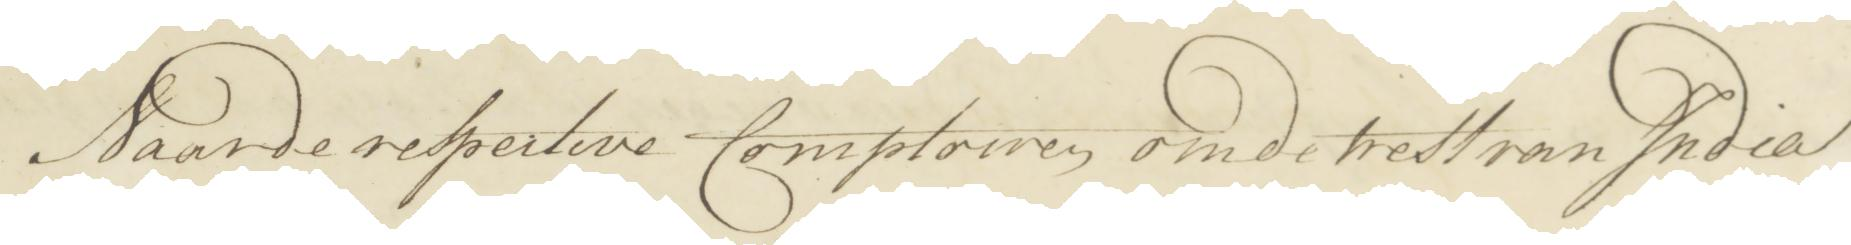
Naar de respective Comptoiren om de west van Jndia
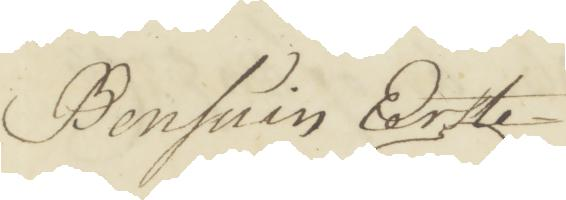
Bensuin Eerste
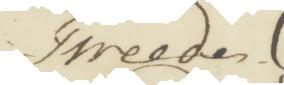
Tweeden.
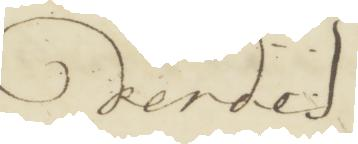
derde.
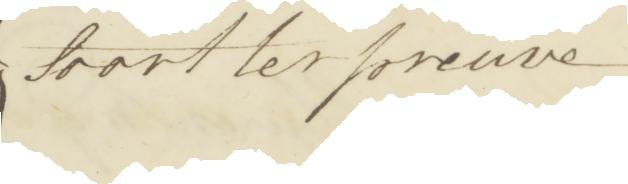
soort ter preuve
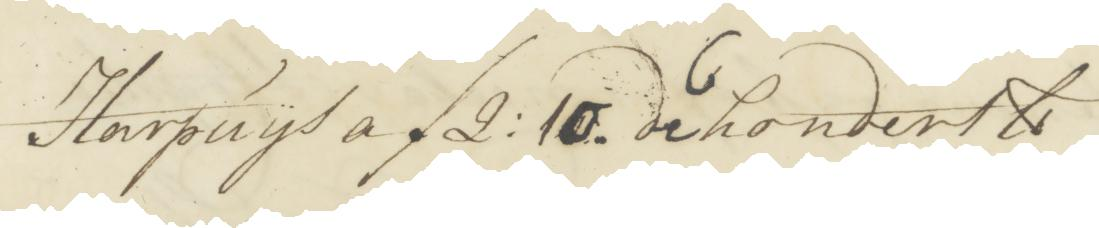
Harpuijs a ƒ 2:10. de ' hondert lb
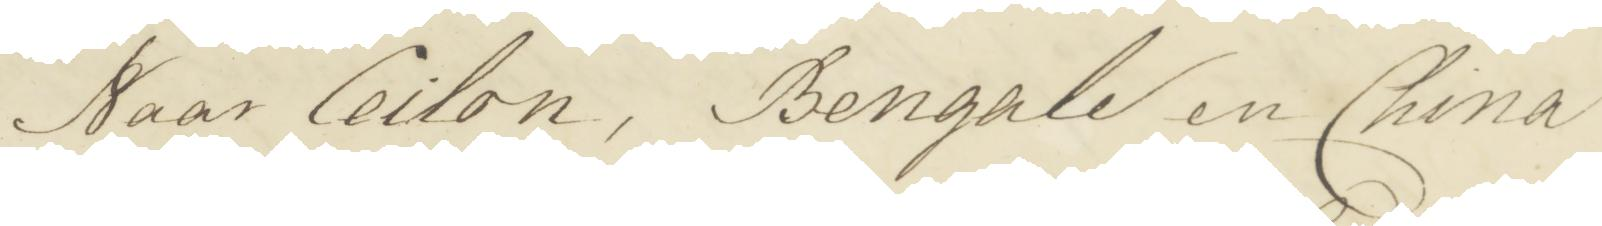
Naar Ceilon, Bengale en China
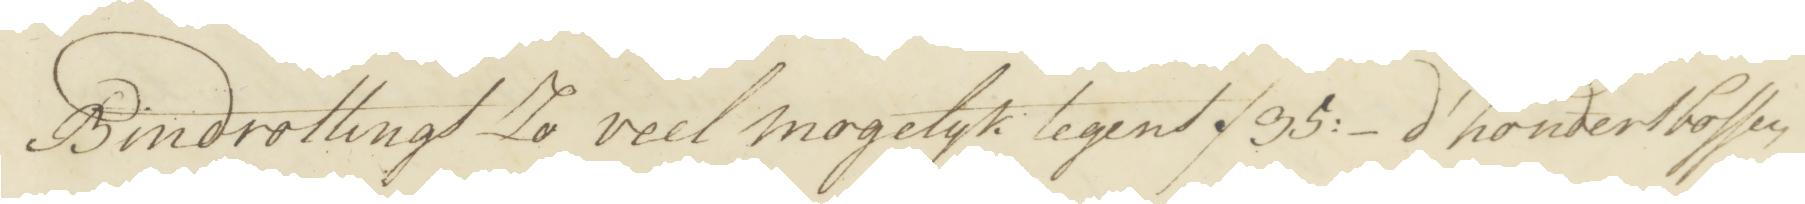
Bindrotting Zo veel mogelyk tegens ƒ 35:- d’ hondert bossen
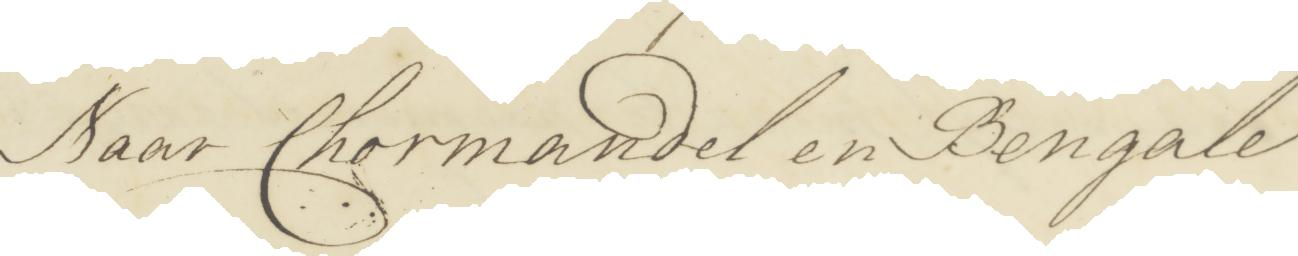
Naar Chormandel en Bengale
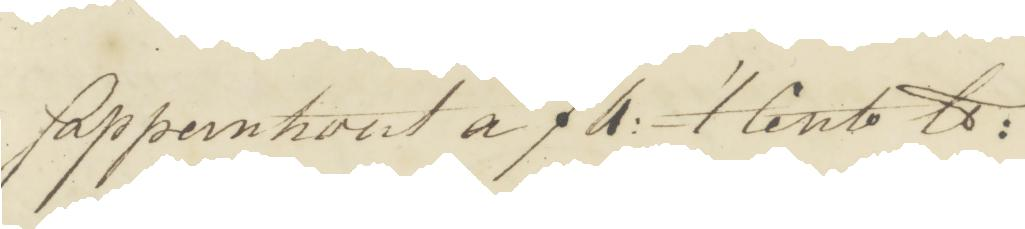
sappanhout a ƒ 4:- 't Cento lb:
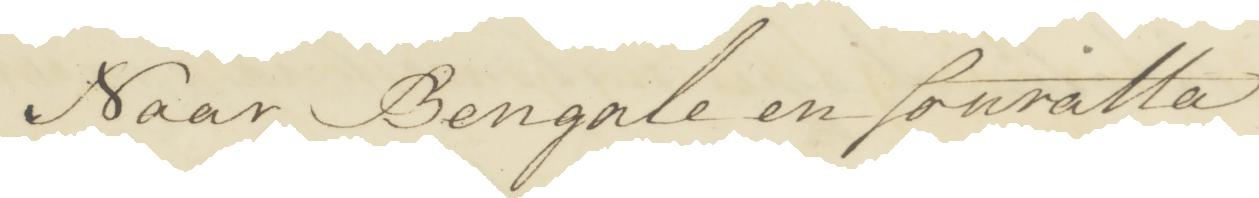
Naar Bengale en Souratta
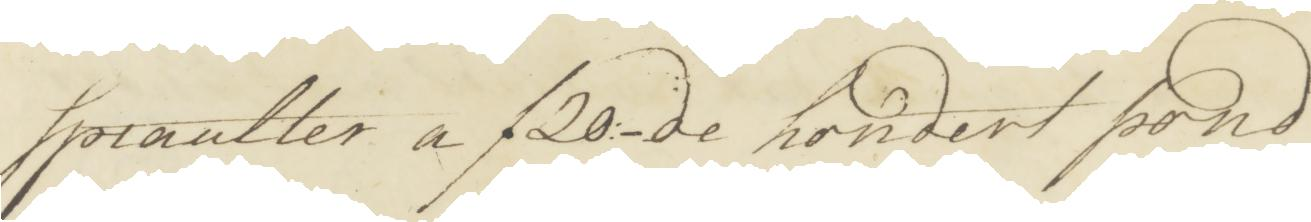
Spiaulter a ƒ 20:- de hondert pond
